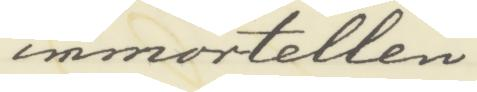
inmortellen
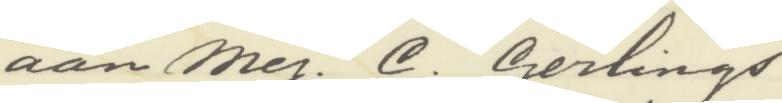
aan Mej. C. Gerlings
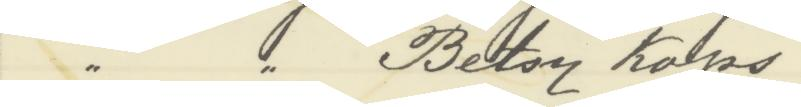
„ „ Betsy kops
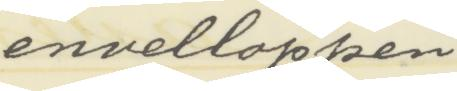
envelloppen
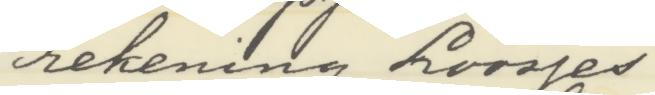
rekening Loosjes
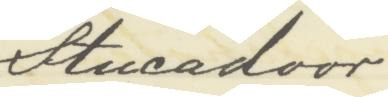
Stucadoor
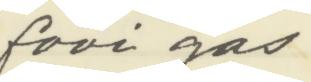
fooi gas
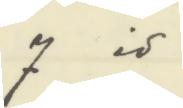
7 id
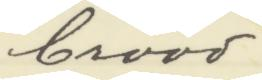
brood
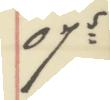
07=5
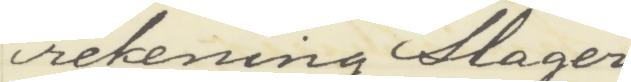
rekening Slager
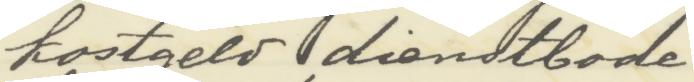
kostgeld dienstbode
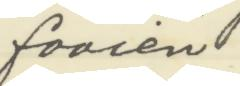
fooien
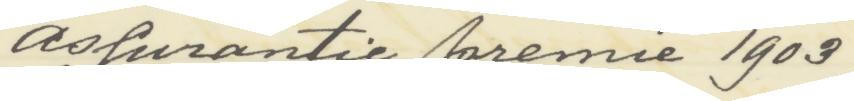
assurantie premie 1903
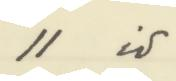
11 id
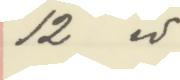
12 id
